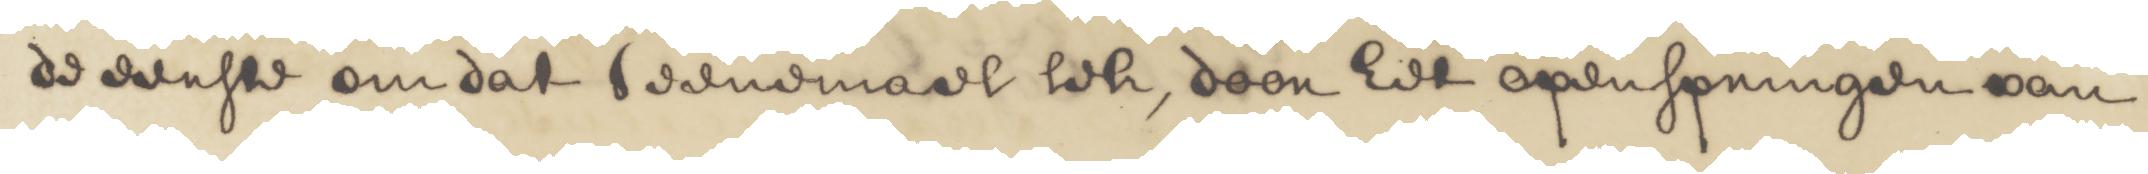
de eerste om dat 't eenemael lek, door het openspringen van
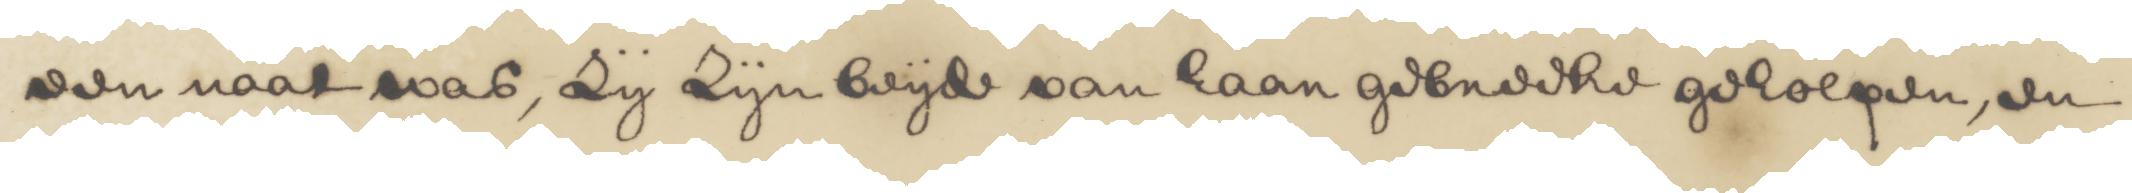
een naat was, Zij Zijn beijde van haar gebreeke geholpen, en
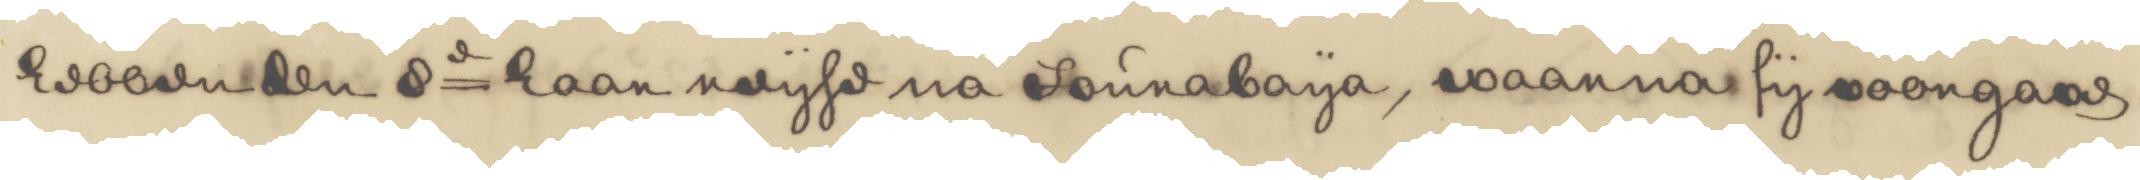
hebben den 8=e haar reijse na sourabaija, waarna sij voorgaven
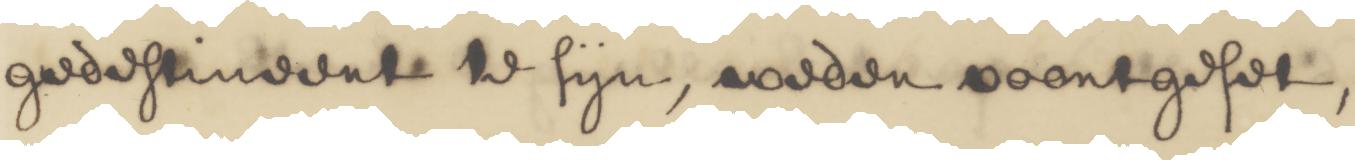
gedestineert te sijn, weder voort geset
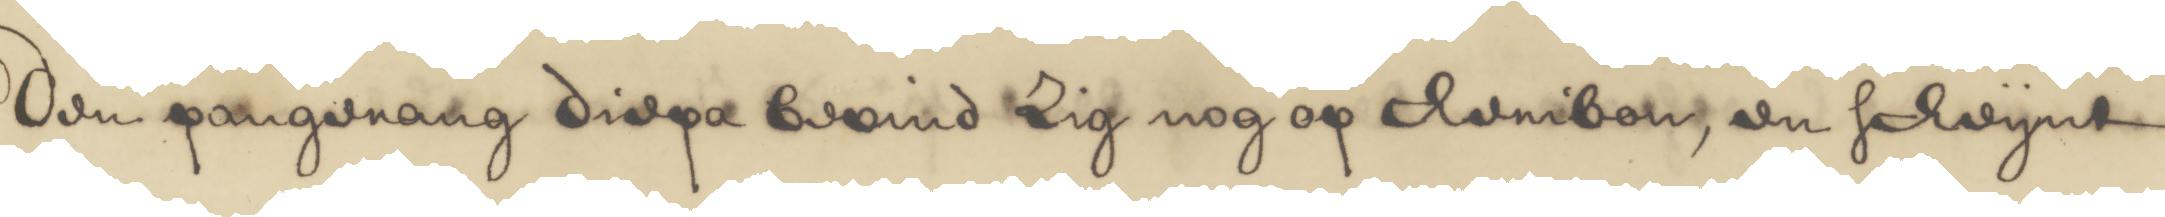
den pangerang diepa bevind Zig nog op cheribon, en scheijnt
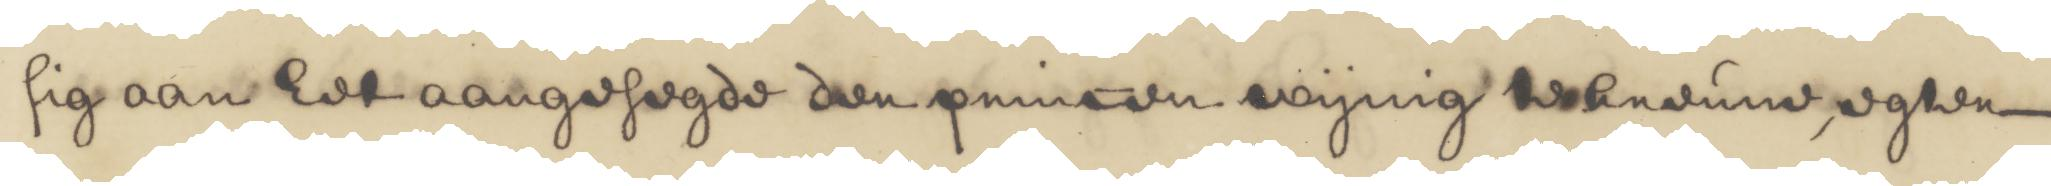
sig aan het aangesegde der princen wijnig te kreune, egter
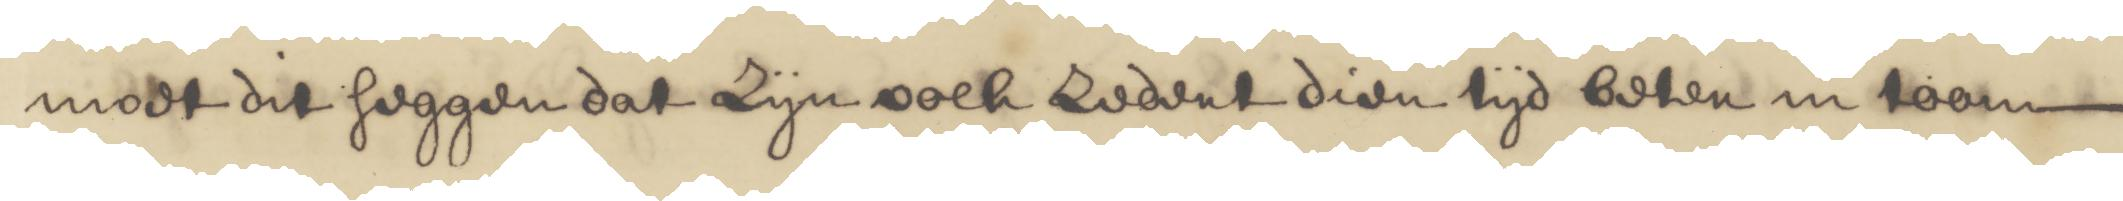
moet dit seggen dat Zijn volk Zedert dien tijd beter in toom
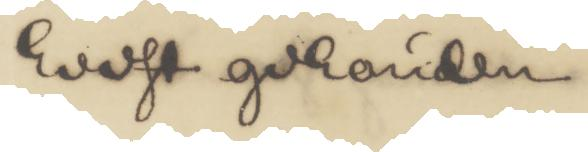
heeft gehouden.
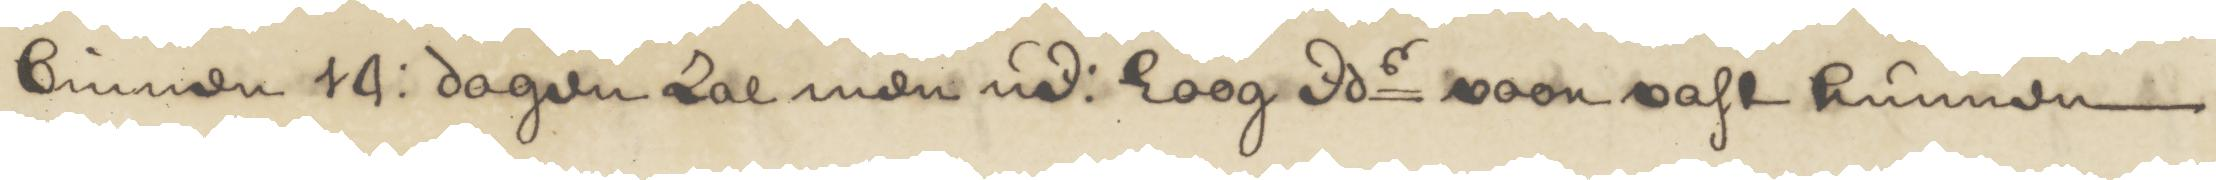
binnen 14: dagen Zal men uE: hoog Ed=s voor vast kunnen
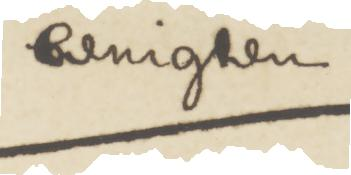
berigten
